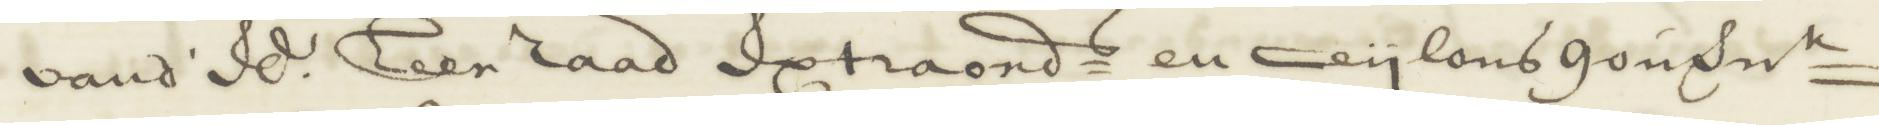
van d’ Ed. heer raad Extraord=s en ceijlons gouvern=r
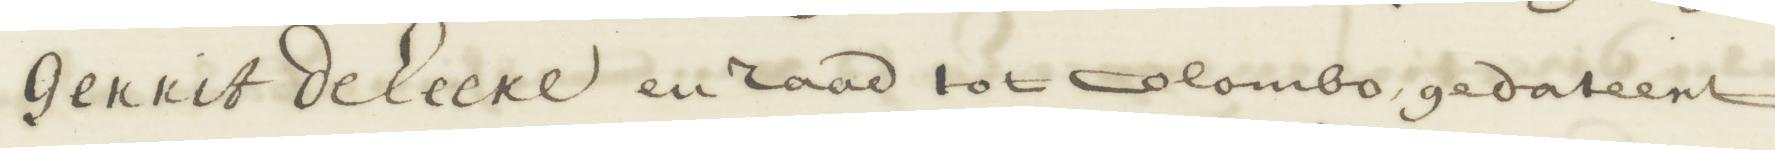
gerrit de heere en raad tot colombo, gedateert
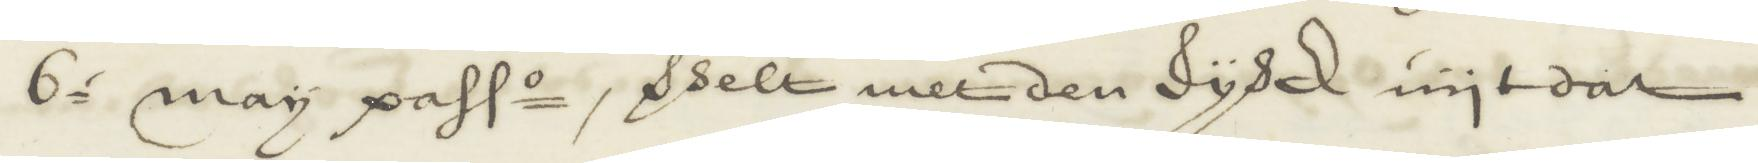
6=' maij pass=o, verselt met den Eijsch uijt dat
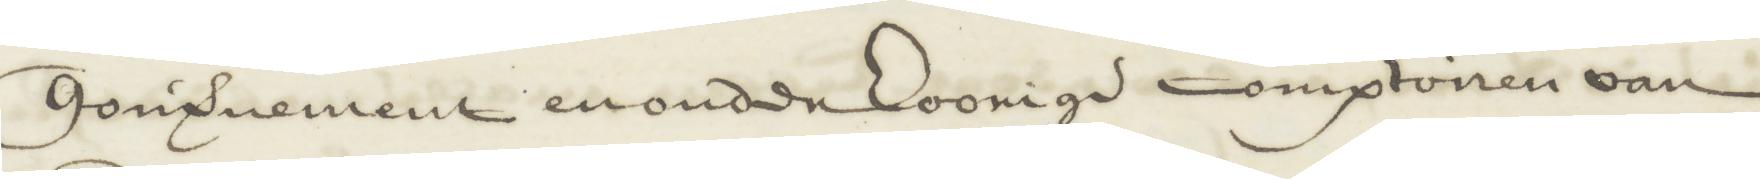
gouvernement en onderhoorige comptoiren van
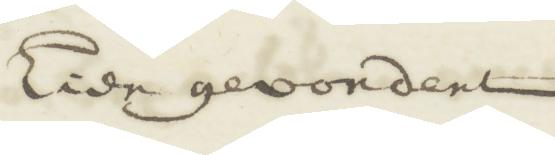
hier gevordert
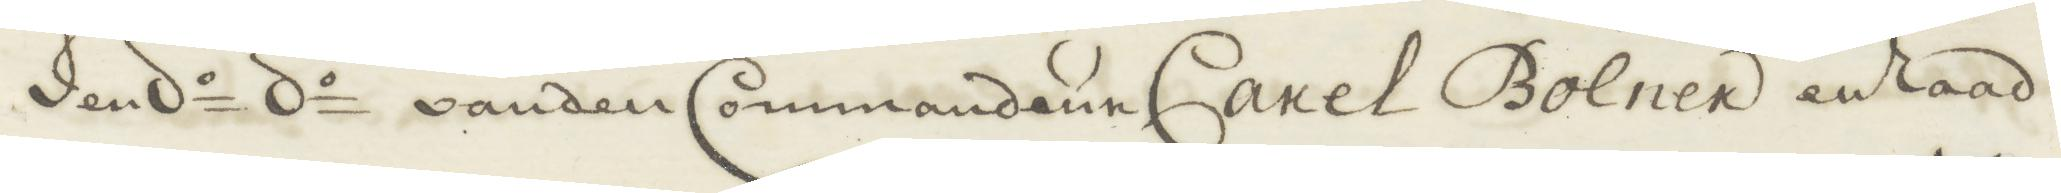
Een d=o d=o van den Commandeur Carel Bolner en Raad
